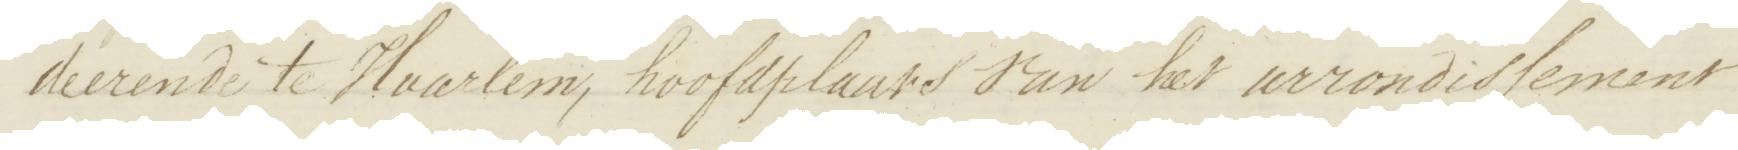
deerende te Haarlem, hoofdplaats van het arrondissement
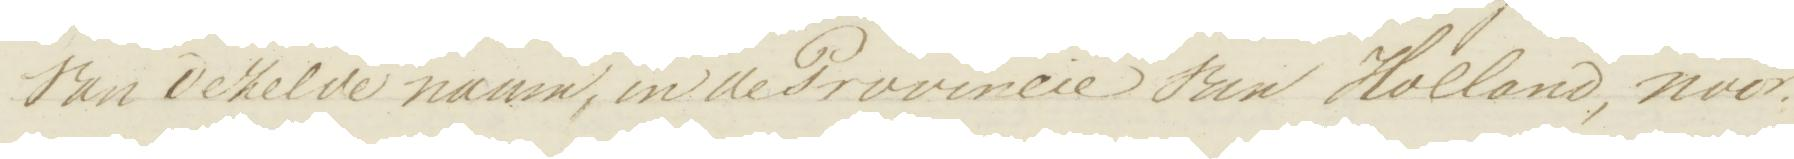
van dezelve naam, in de Provincie van Holland, noor
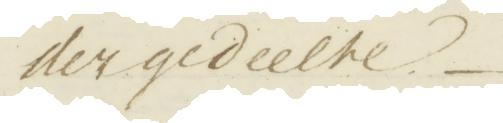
der gedeelte. —
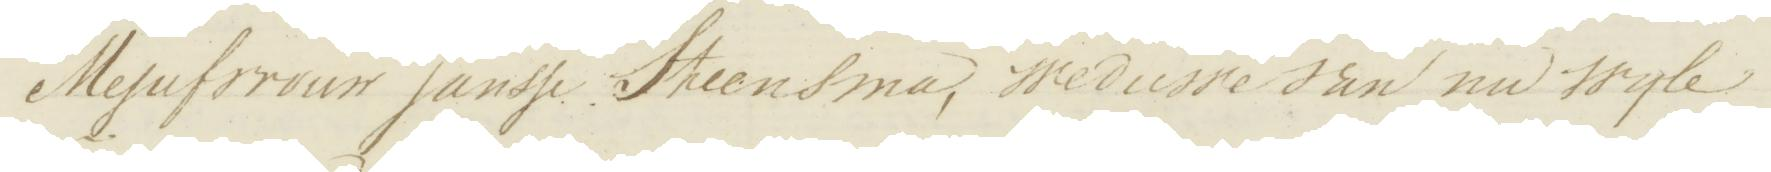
Mejufvrouw Jansse Steensma, weduwe van nu wyle
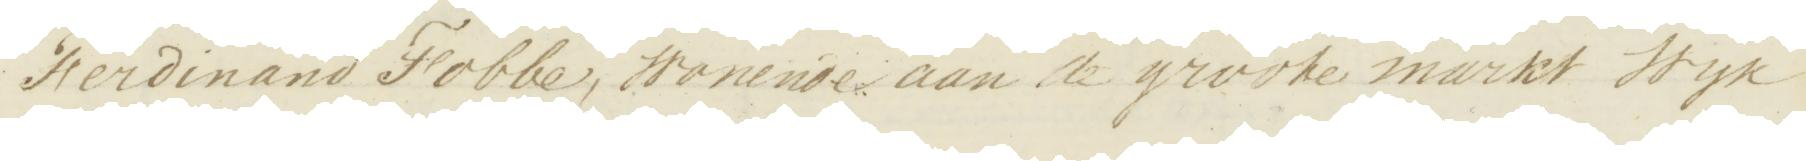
Ferdinand Fobbe, wonende aan de groote markt Wyk
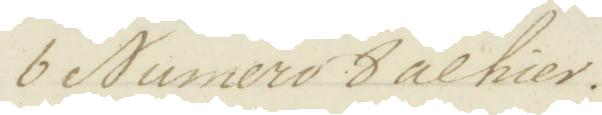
6 Numero 8 alhier.
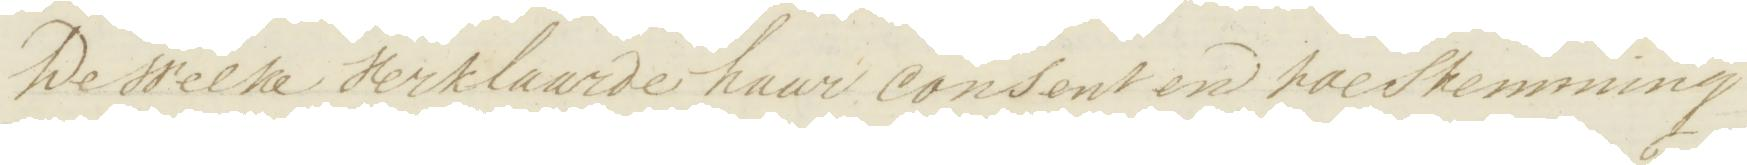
De welke verklaarde haar consent en toestemming
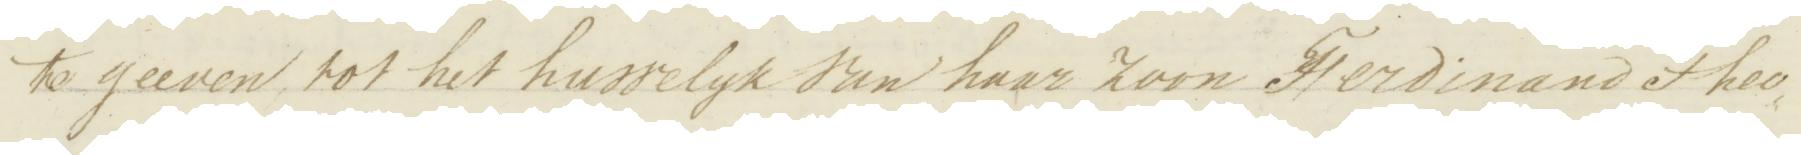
te geeven tot het huwelyk van haar zoon Ferdinand Theo„
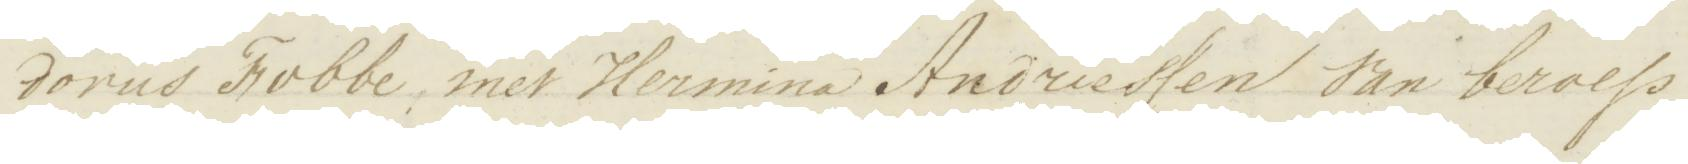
dorus Fobbe, met Hermina Andriessen van beroep
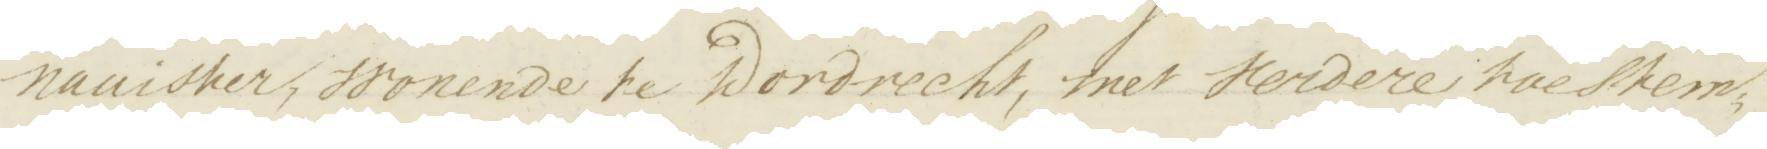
naaister, wonende te Dordrecht, met verdere toestem„
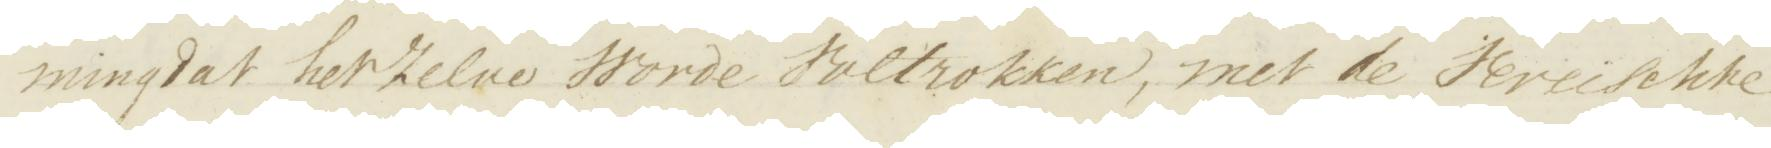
ming dat het zelve worde voltrokken, met de Vereischte
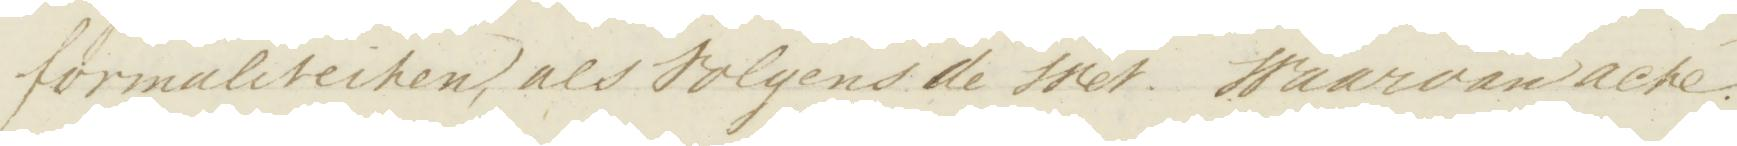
formaliteiten, als volgens de wet. Waarvan acte.
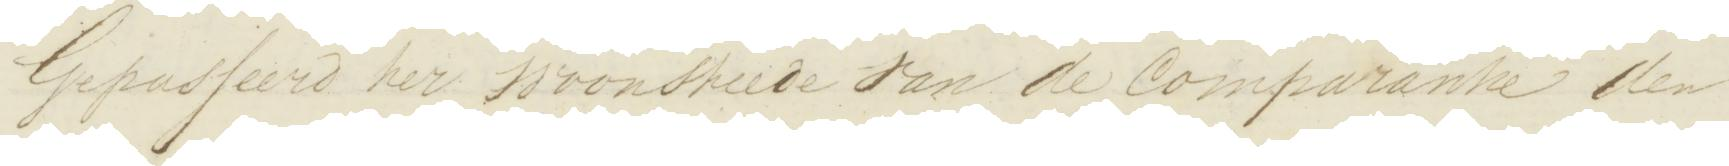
Gepasseerd ter woonsteede van de Comparante den
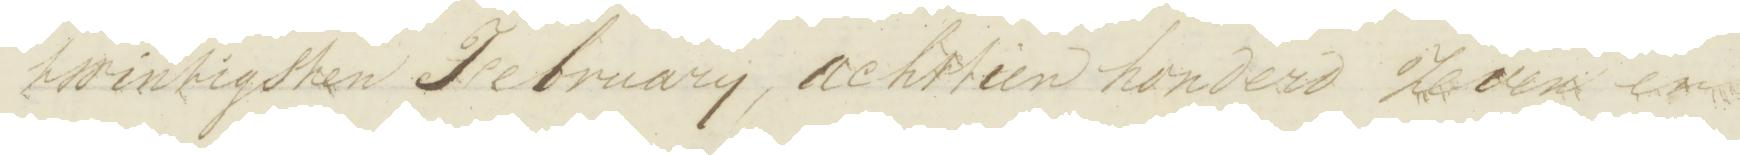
twintigsten February, achttien honderd zeven en
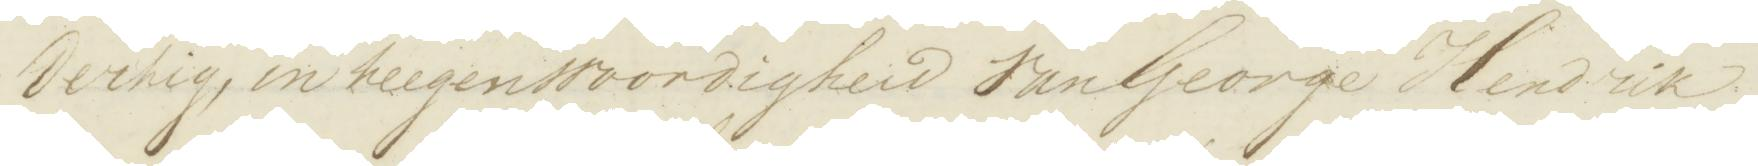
Dertig, in teegenwoordigheid van George Hendrik
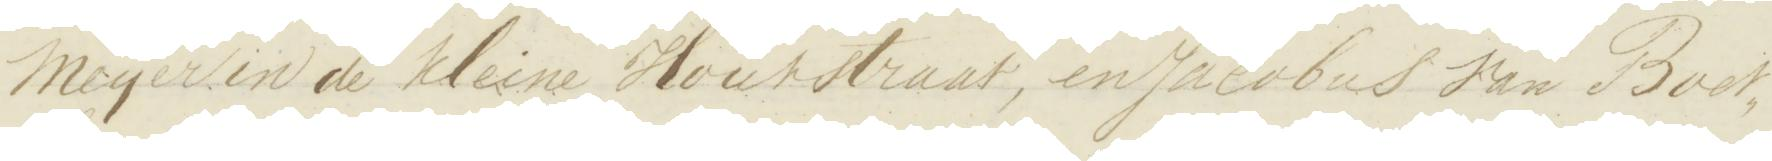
Meyer in de kleine Houtstraat, en Jacobus van Boet„
